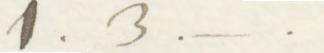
1. 3. —.
